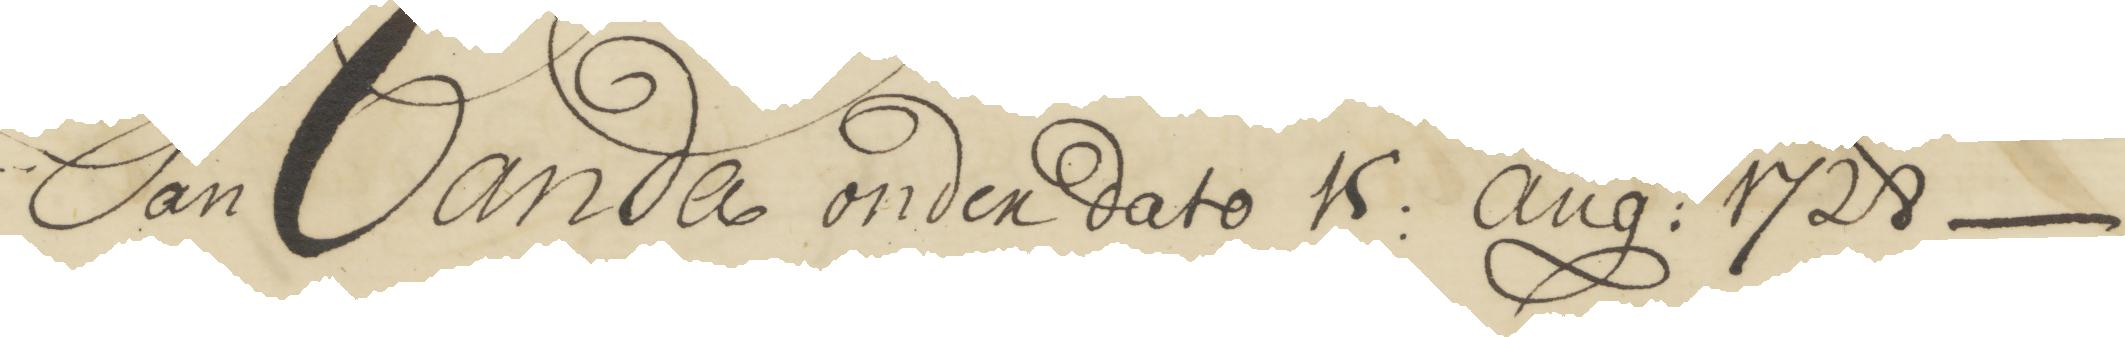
Van Banda onder dato 15: aug:to 1728 -
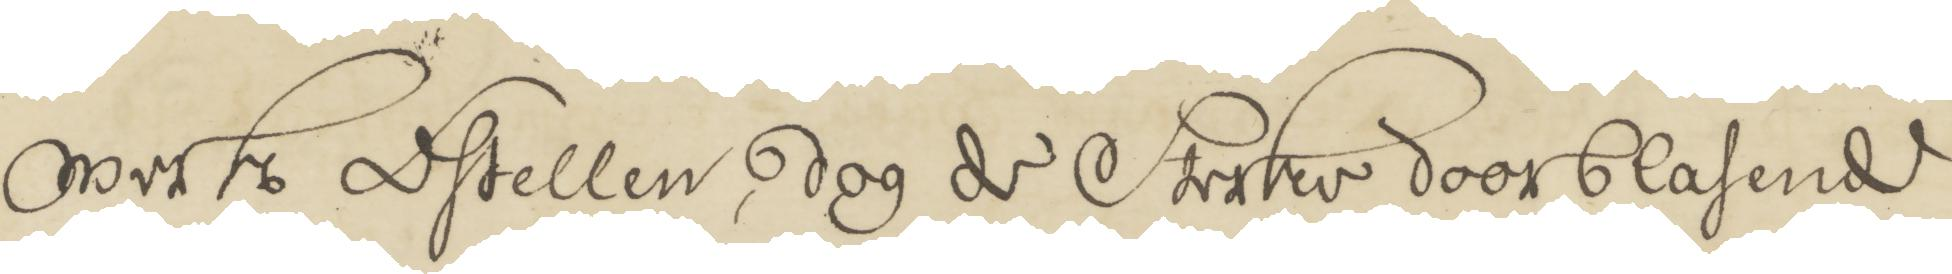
werk testellen, dog de Sterke doorblasende
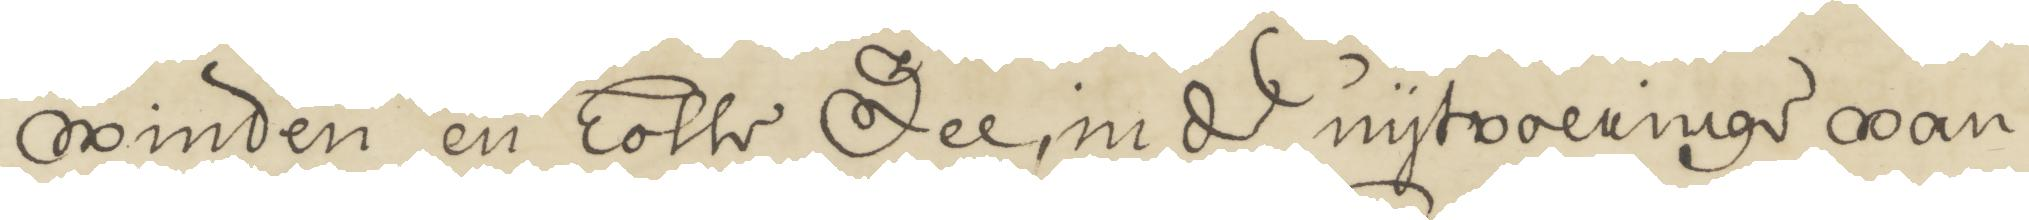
wind en en holle Zee, in de uijtvoeringe van
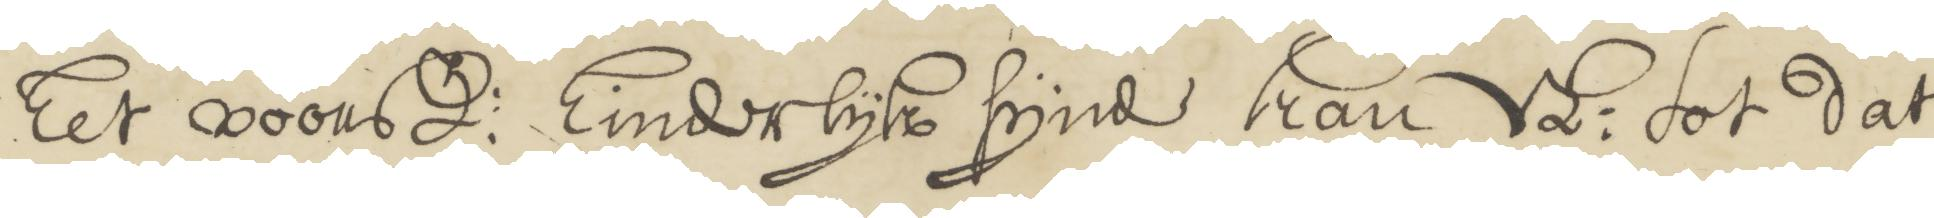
het voorsz: hinderlijk sijnde kan UE: tot dat
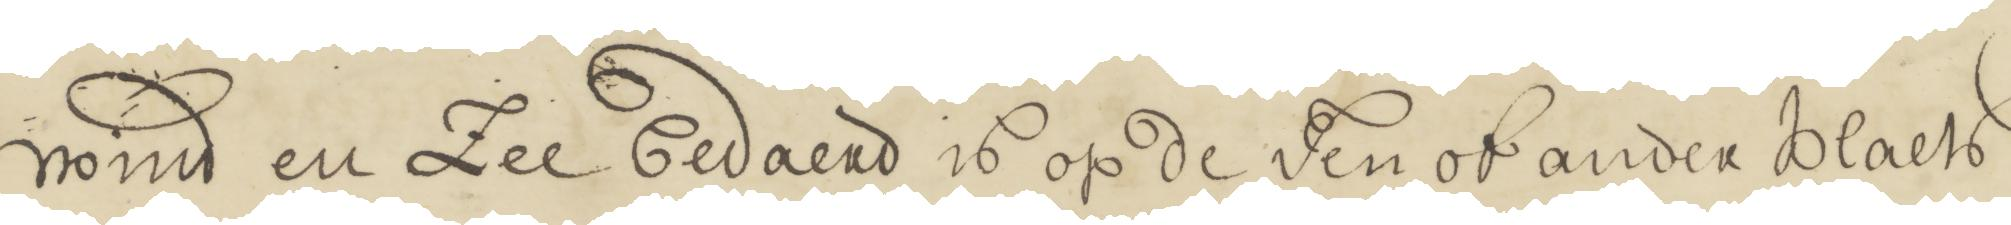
wind en Zee bedaerd is op de Een of ander plaets
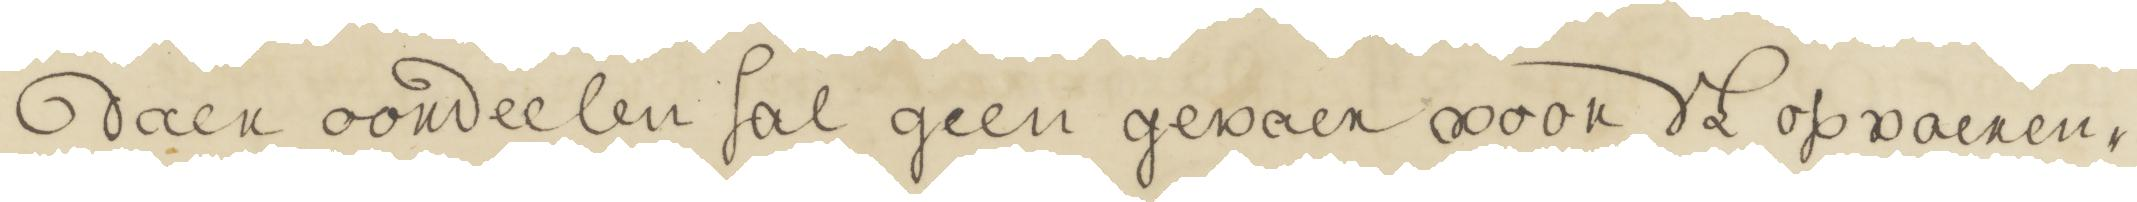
daer oordeelen Sal geen gevaer voor VE op vaeren„
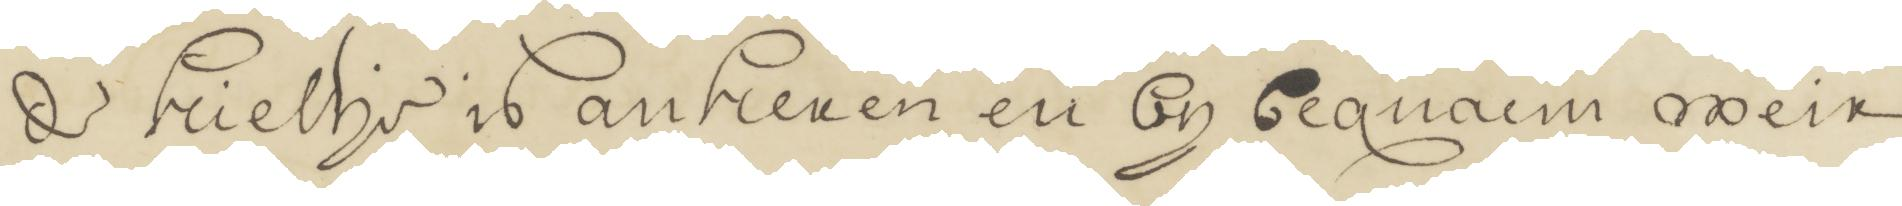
de kieltje is ankeren en by bequaem weir
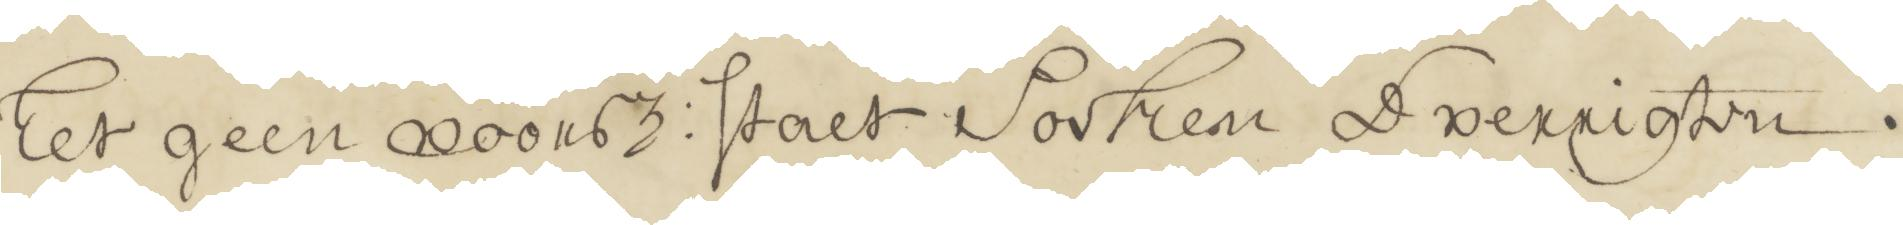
het geen voorsz: Staet Soeken te verrigten.
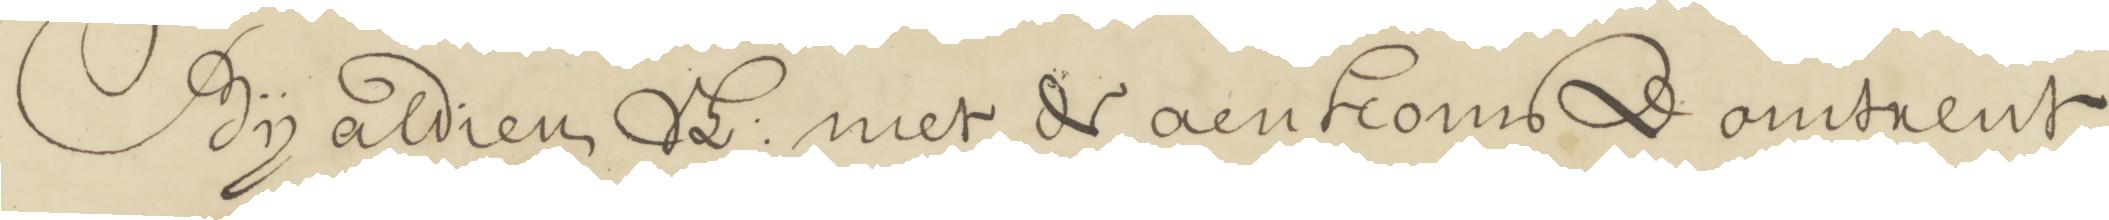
Bij aldien UE: met de aenkomste omtrent
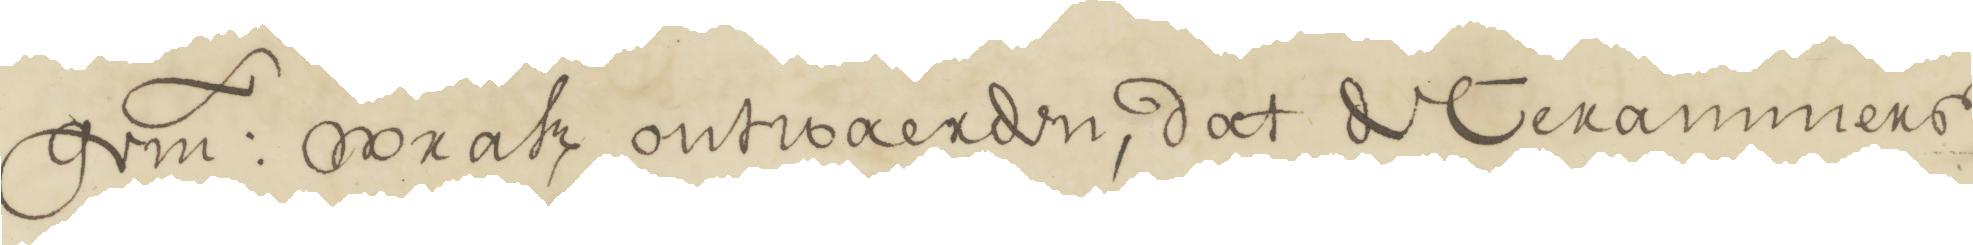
gem:e wrak ontwaerden, dat de Cerammers
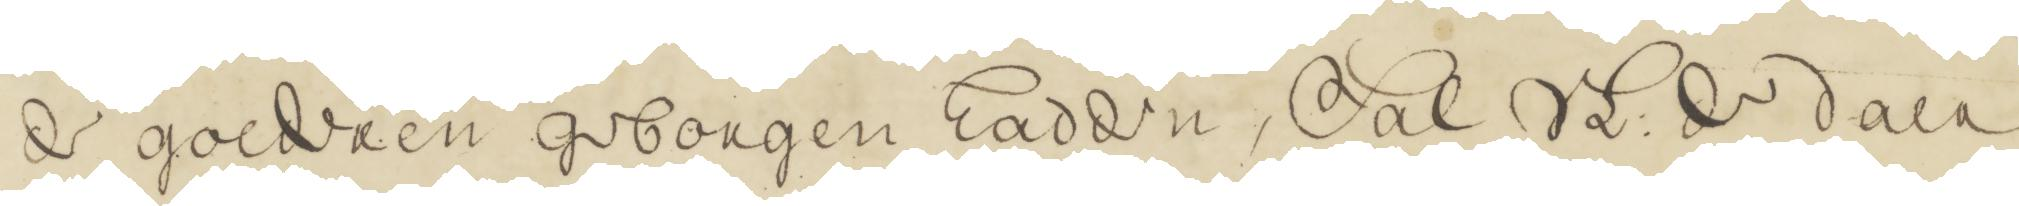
de goederen geborgen hadden, Sal UE: de daer
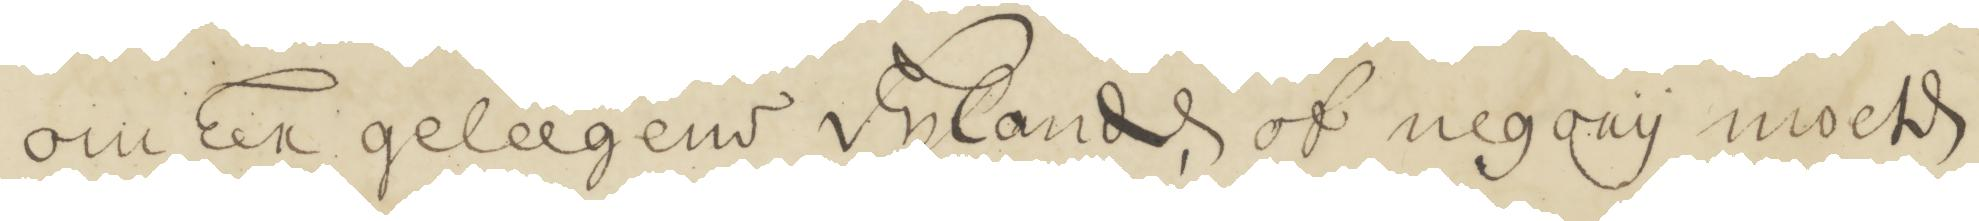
om her geleegene Eylanden, of negorij moeten
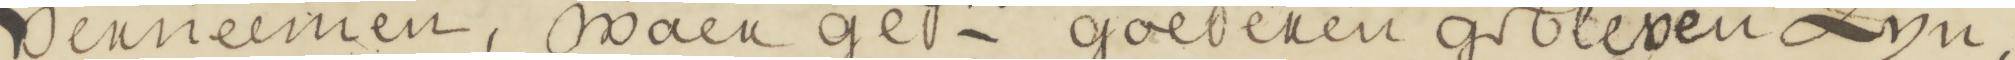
verneemen, maer ged-te goederen gebleven Zijn,
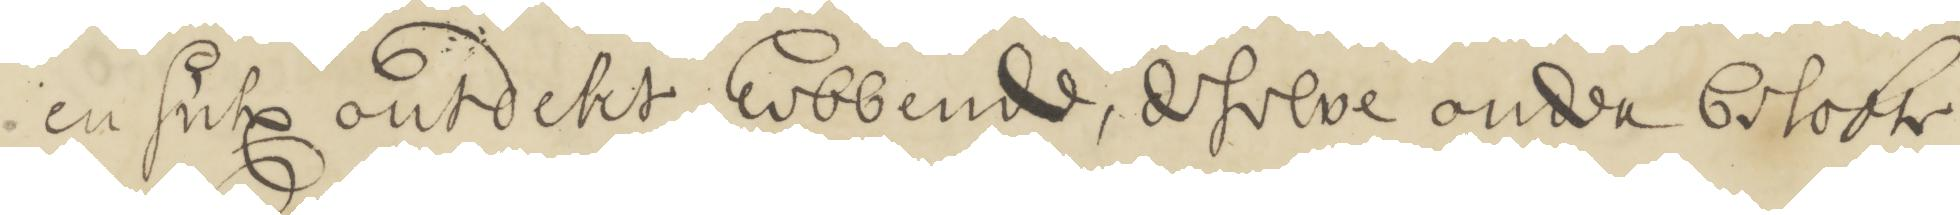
en sulx ontdekt hebbende, deselve onder belofte
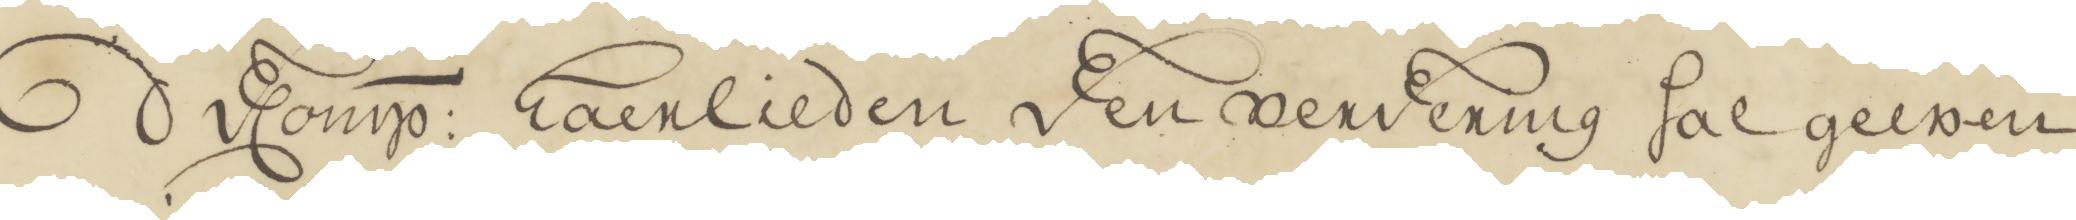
d’ EComp: haerlieden Een vereering Sal geeven,
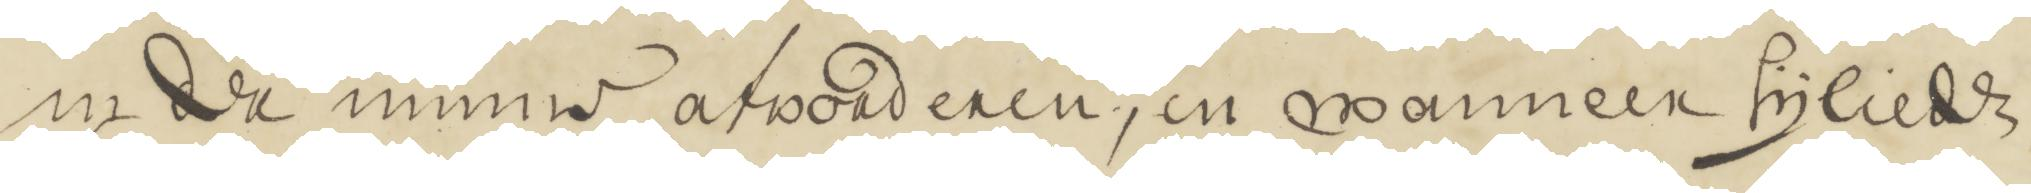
in der minne afvorderen, en wanneer sij lieden
